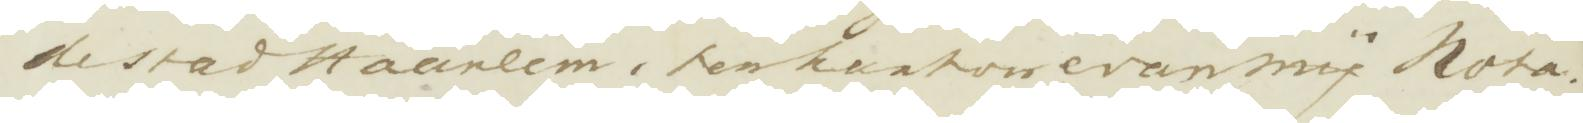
de stad Haarlem, ten kantoor evanmij Nota„
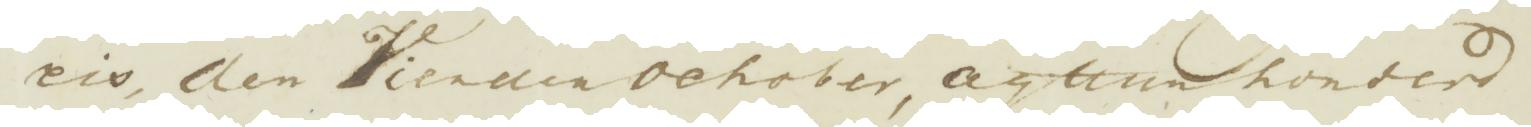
ris, den Vierden october, agttien honderd
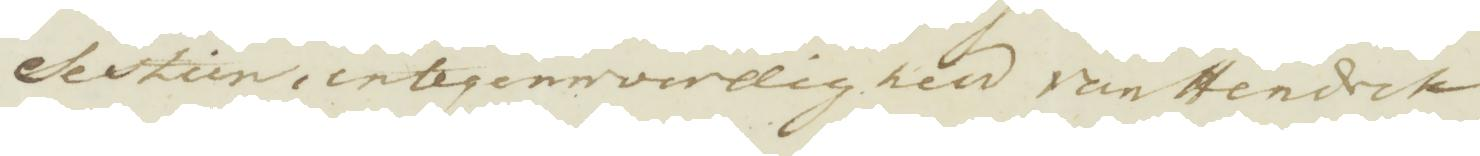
sestien, in tegenwoordigheid van Hendrik
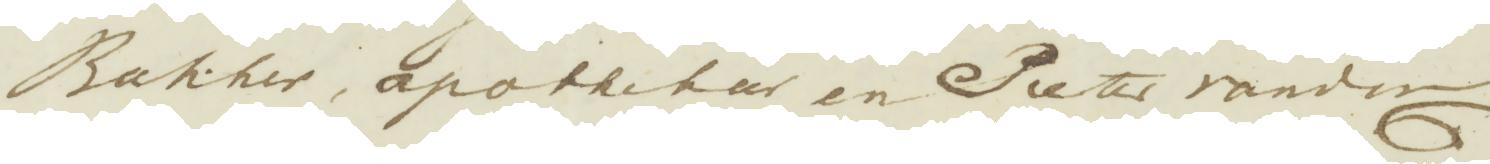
Bakker, apotheker en Pieter vander
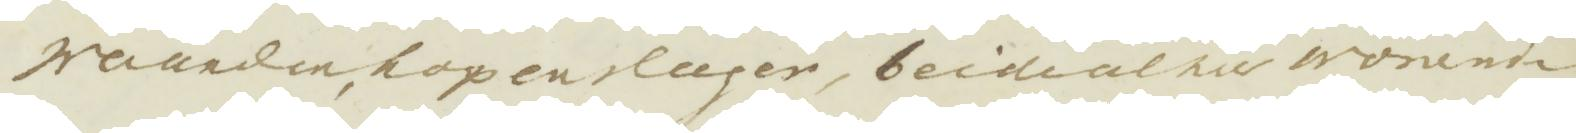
Waarden, koperslager, beide alhier wonende
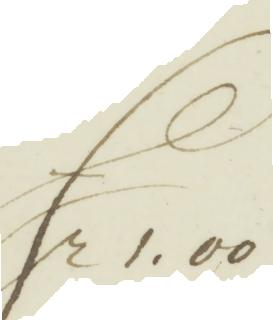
Fr 1.00
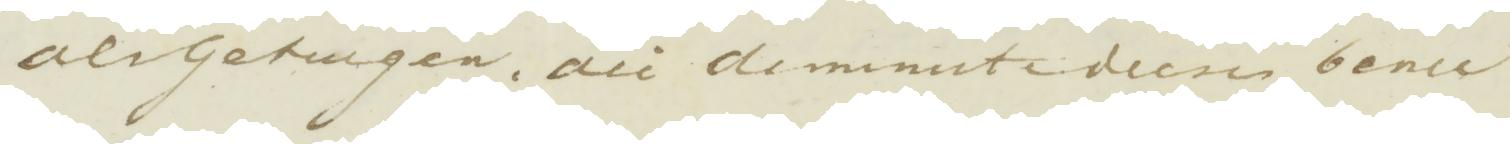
als getuigen, die de minute deeses bene
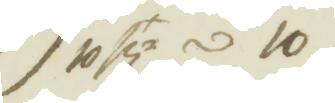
10 pr=t 10
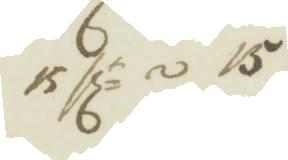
15 pr=t 15
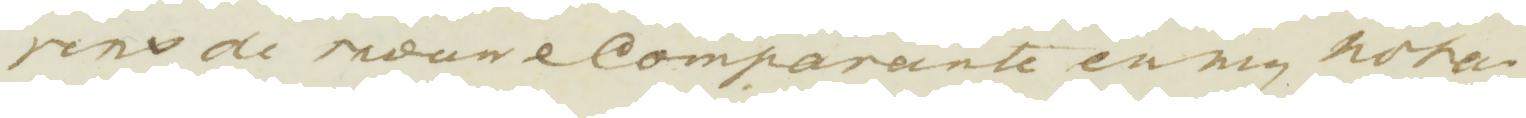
vens de vrouwe comparante en my Nota
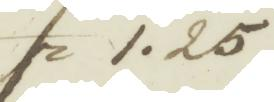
Fr 1.25
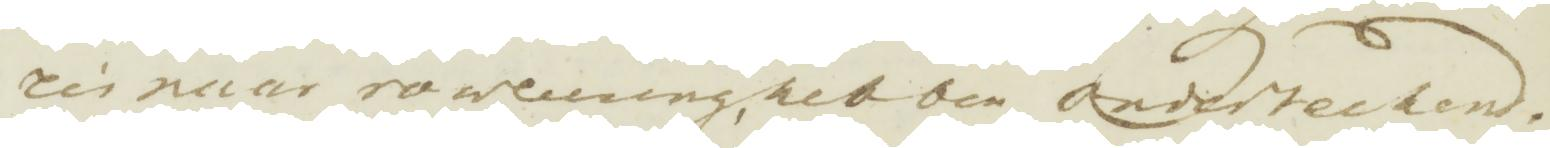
ris naar voorlezing, hebben onderteekend.
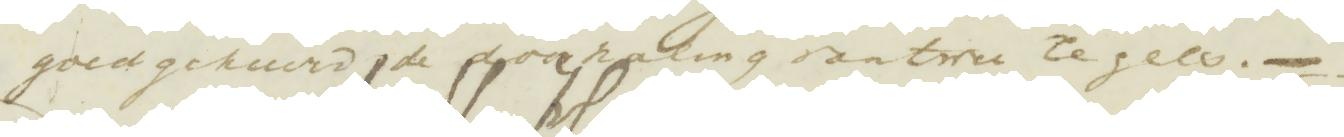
goed gekeurd de doorhaling van twee regelen.-
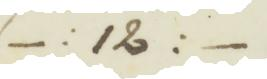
-:12:-
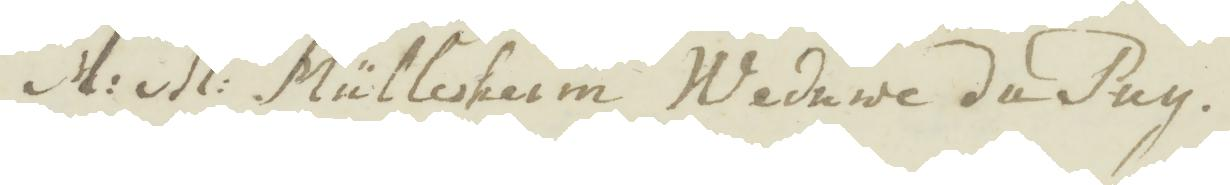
A:M: Hüllesheim Weduwe du Puy
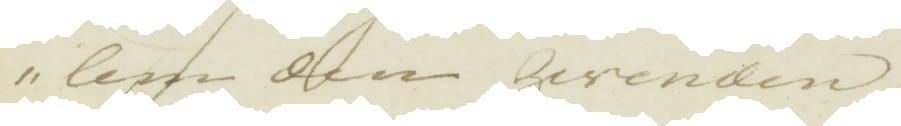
„lem den Zevenden
